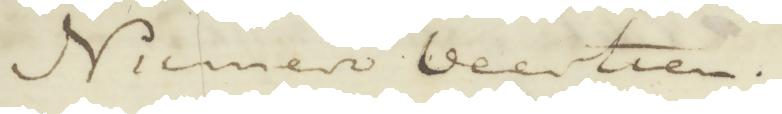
Nummer veertien.
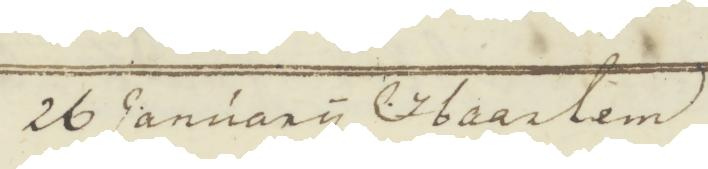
26 Januarij Haarlem
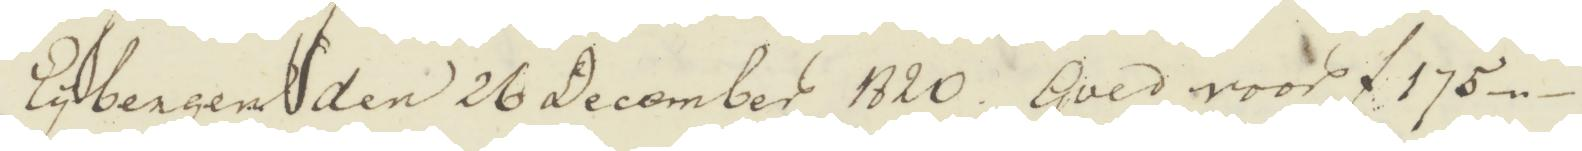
Hijbergen den 26 December 1820. Gold voor ƒ 175–„–
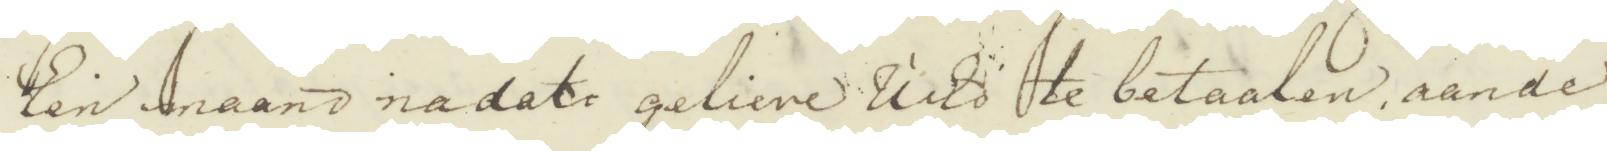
Een maand na dato gelieve UEd te betaalen, aan de
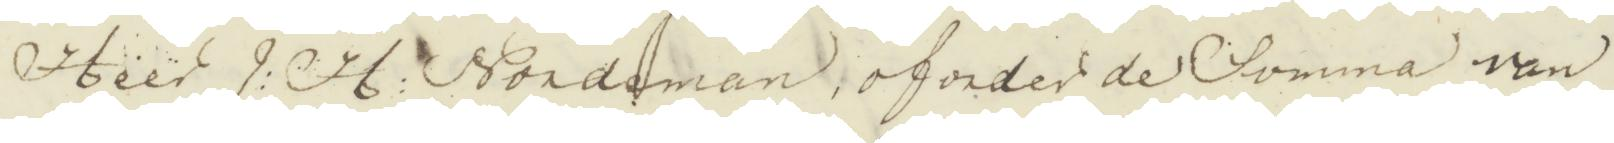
Heer J: H: Nordeman, of order de Somma van
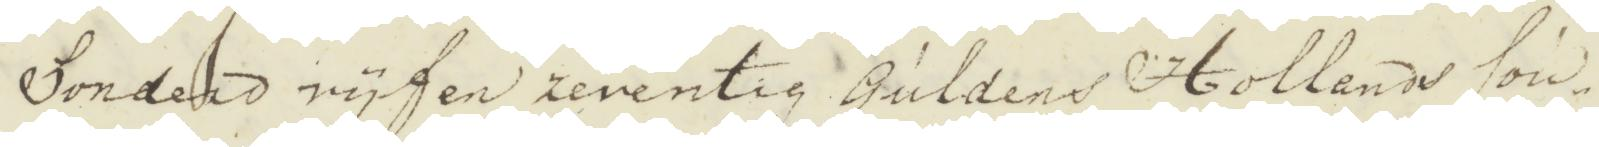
Honderd vijf en zeventig Guldens Hollands Cou„
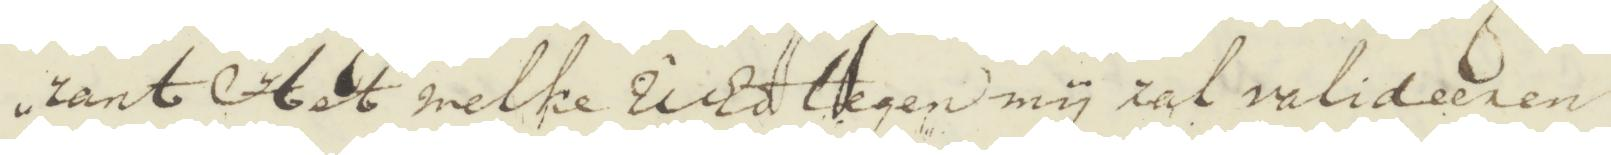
„rant Het welke UEd tegen mij zal valideeren
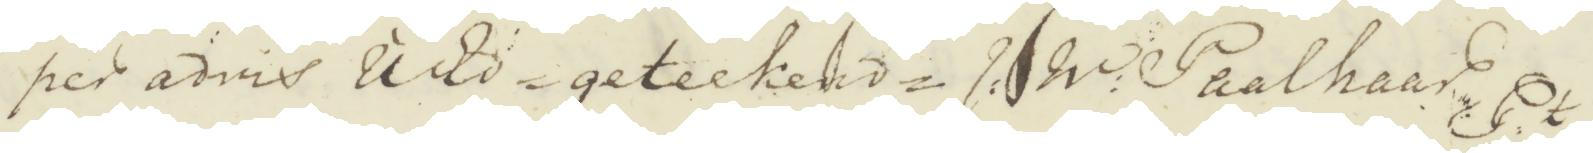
per advis UEd = geteekend = J: W: Paalhaar P:t
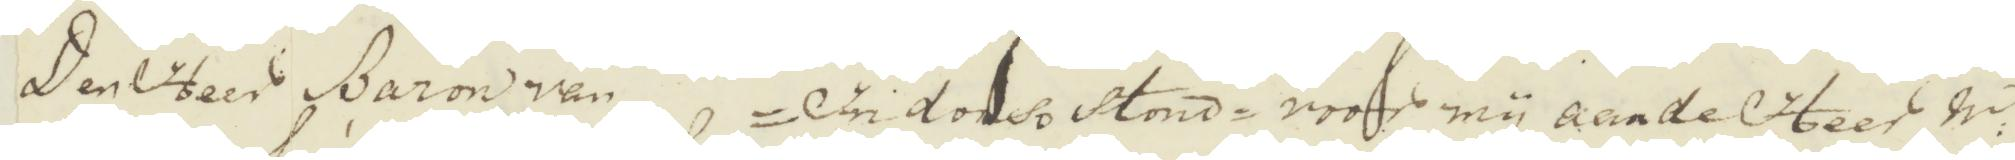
Den Heer Baron van =In dorso stond = voor mij aan de Heer W:
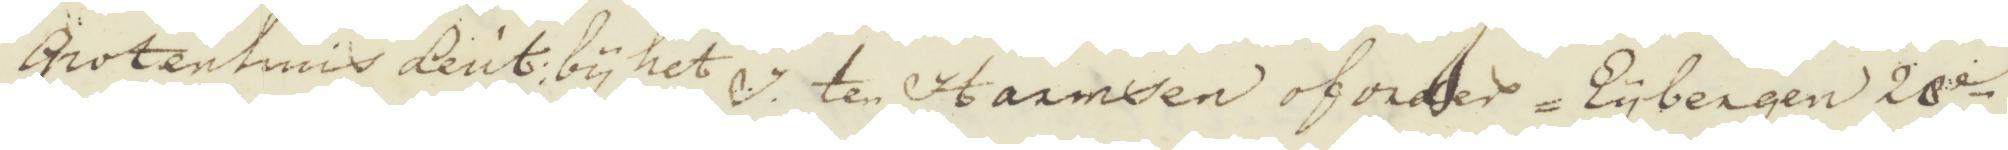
Grotenhuis Leut: J. ten Harmsen of onder = Hijbergen 28e–
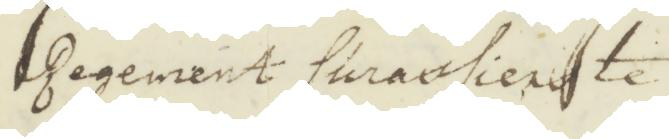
Regement Curassiens te
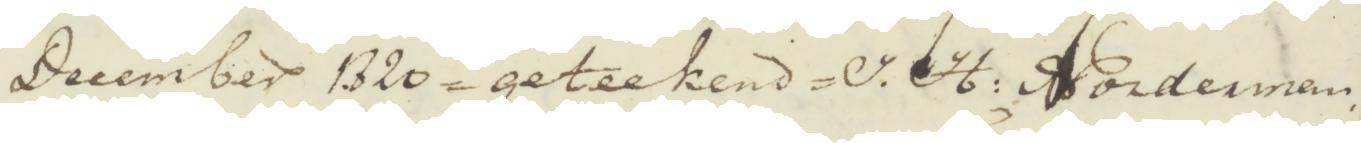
December 1820 = geteekend = J. H: Norderman
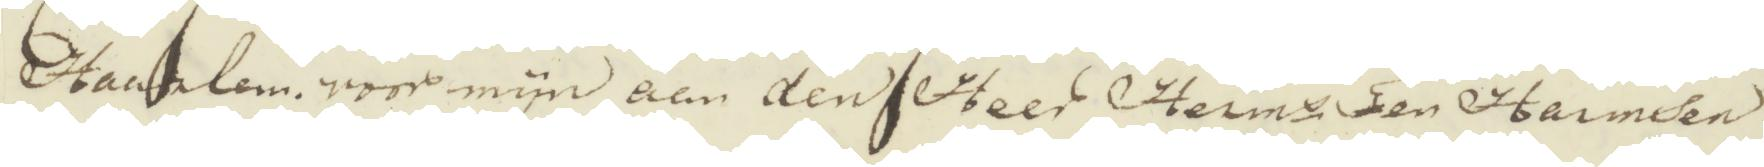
Haarlem. voor mijn aan den Heer Herm-s Ten Harmsen
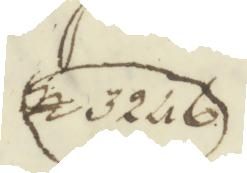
n 3246.
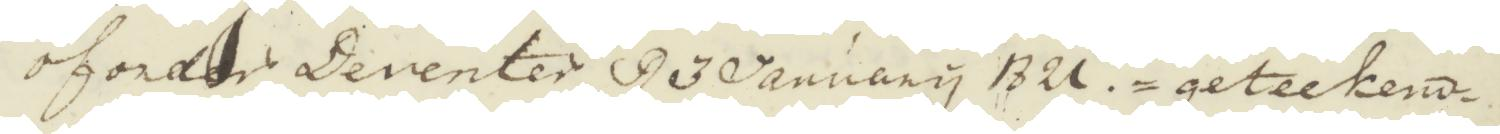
of order Deventer R3 Januarij 1821. = geteekend =
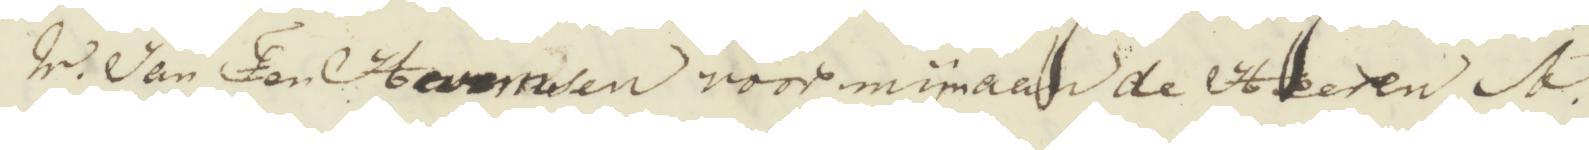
W. Jan Ten Harmsen vor mijn aan de Heeren A.
